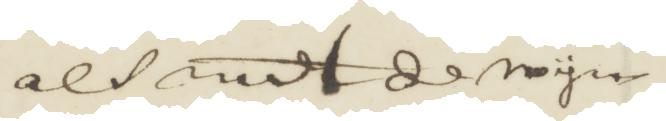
als met de wijn
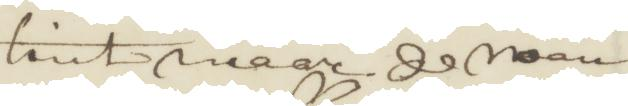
tint maar de wan
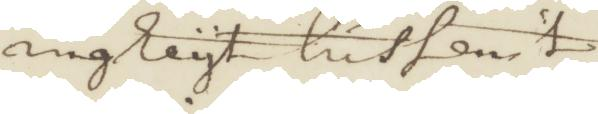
nigheijt tussen ’t
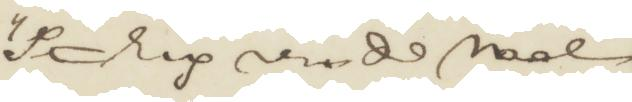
'schip en de wal
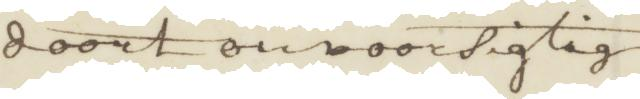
door 't onvoorsigtig
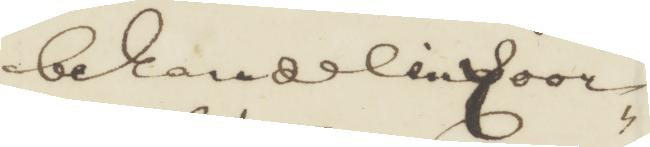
behandelen veroor„
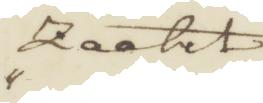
„zaakt
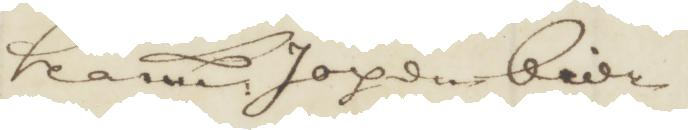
kann: Jopen bier
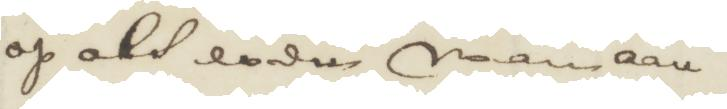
op als evens wan aan
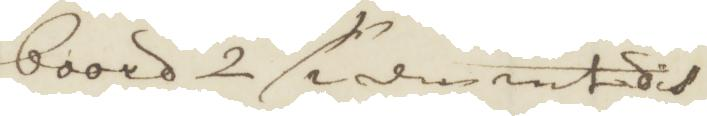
boord 2½ en in 't dis
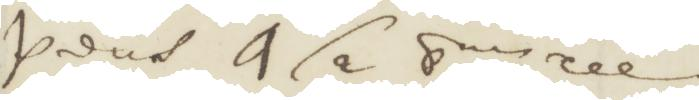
pens 4½ d=m ree
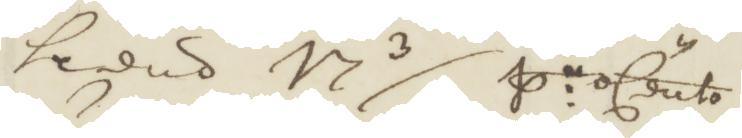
kend 17¾ p:r Cento
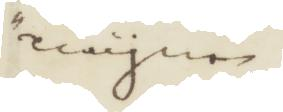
ruijm
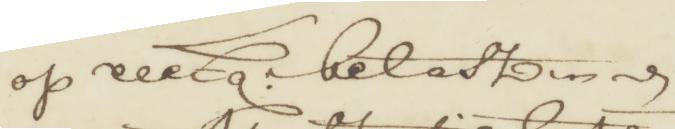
op reecq: belasten en
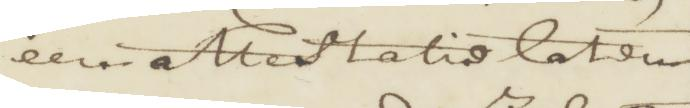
een Attestatie laten
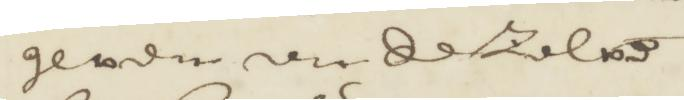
geven en dezelve
